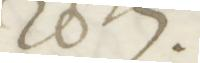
287.
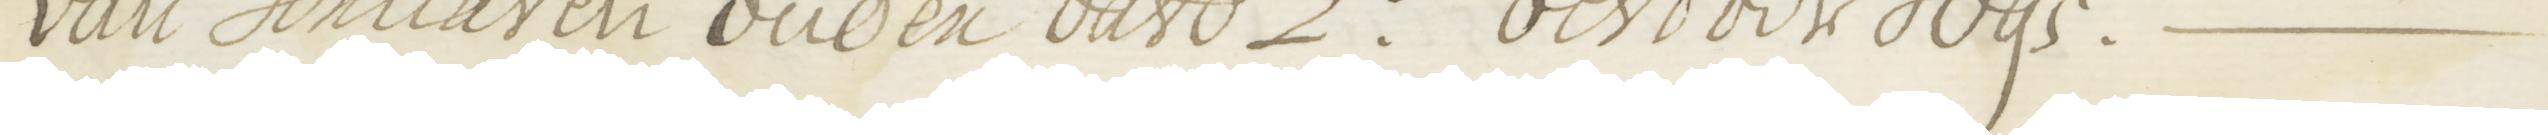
Van Ternaten onder dato P.o october 1695. —
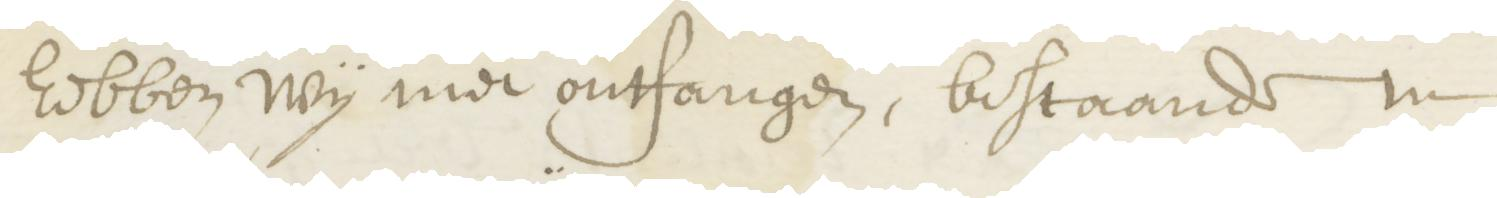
hebben wij niet ontfangen, bestaande in
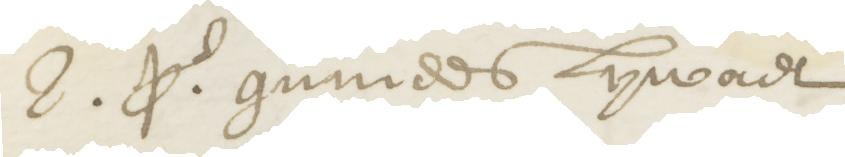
2. p.s guinees lijwaet
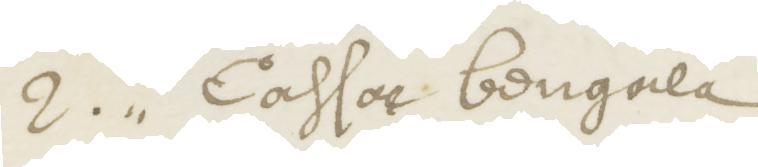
2. „ Cassoe bengala
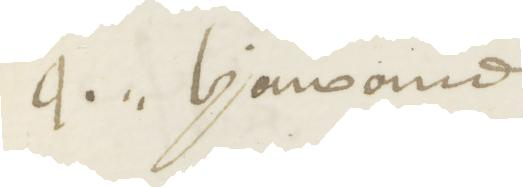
4. „ tjawonie
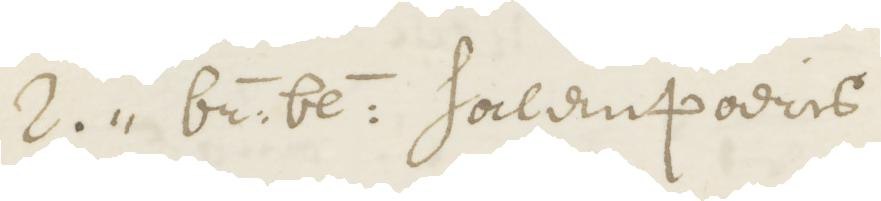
2. „ br: bl: salempoeris
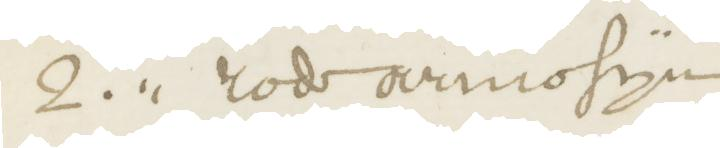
2. „ rode armosijn
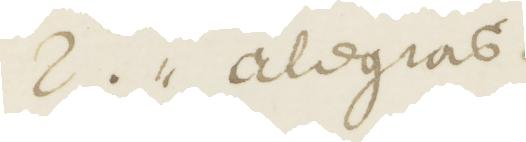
2. „ alegias
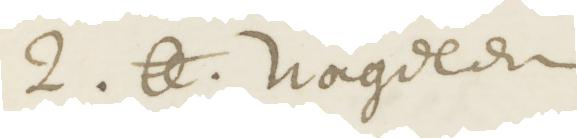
2. lb. nagelen
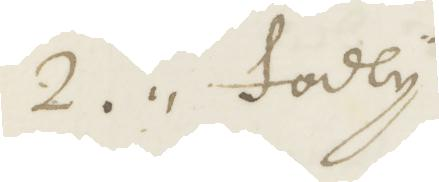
2. „ foelij
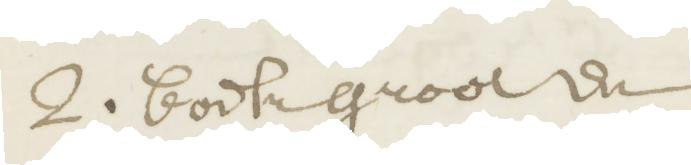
2. boek groot en
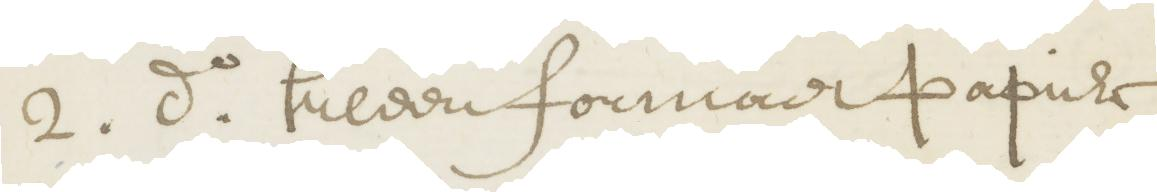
2. d.o kleen formaet papier
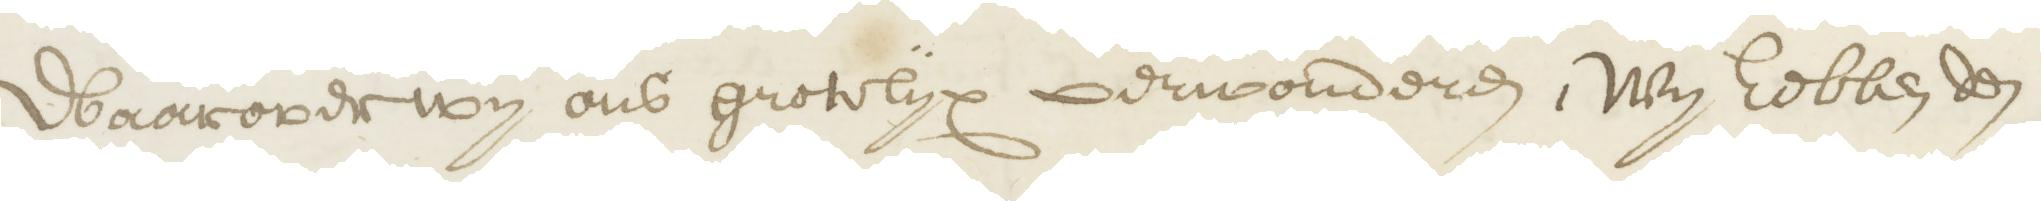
waar over wij ons grotelijx verwonderen, wij hebben den
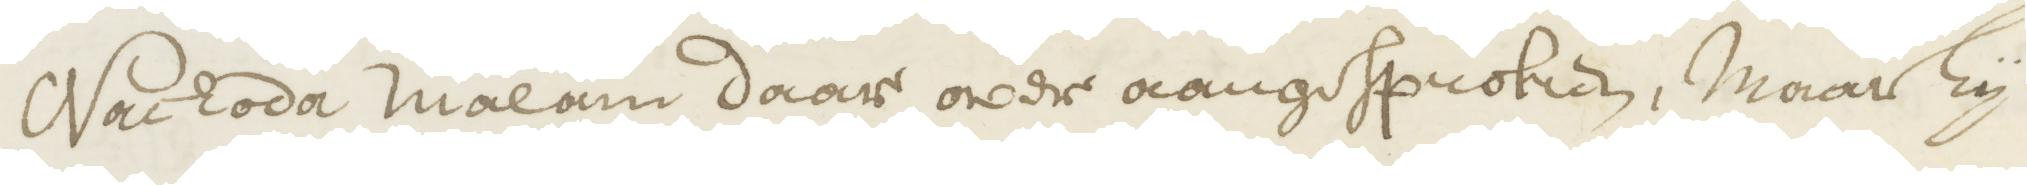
Nachoda malam daar over aangesproken, maar hij
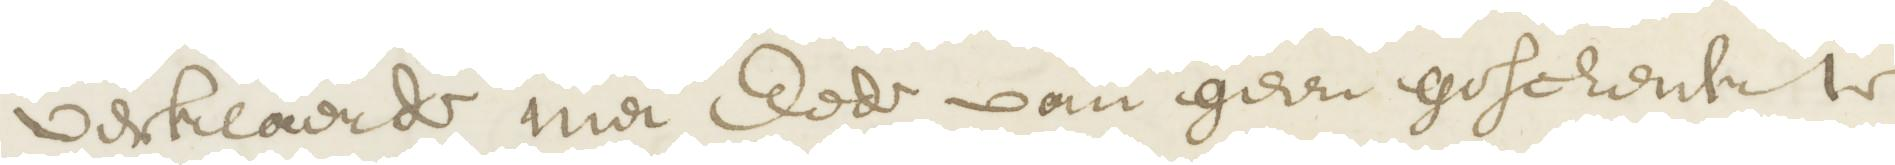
verklaerde met Eede van geen geschenk te
